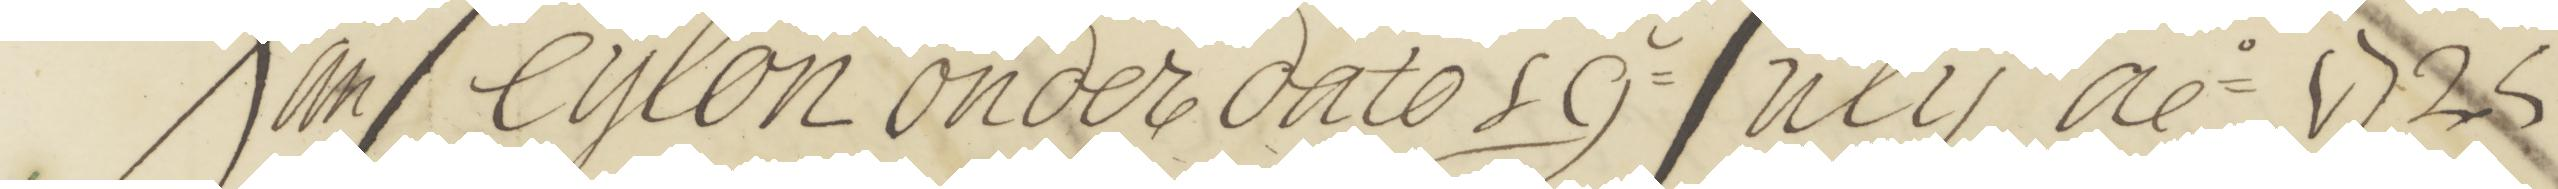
Van Ceijlon onder dato 19=' Julij ae:o 1725
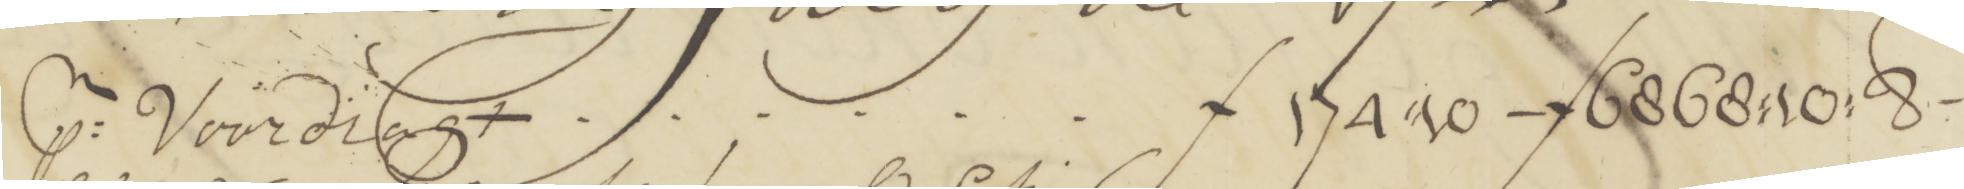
p:s Voordragt - . - - - - ƒ 174„10-ƒ6868„10:8-
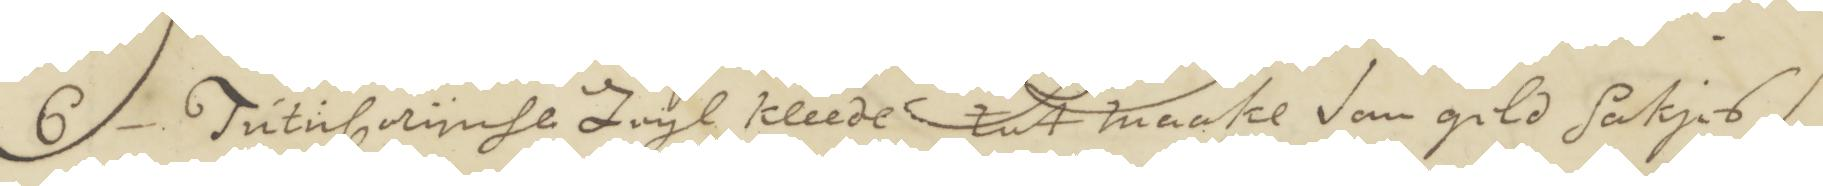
6 —. Tutucorijnse zeijl kleede tot maake van geld sakjes
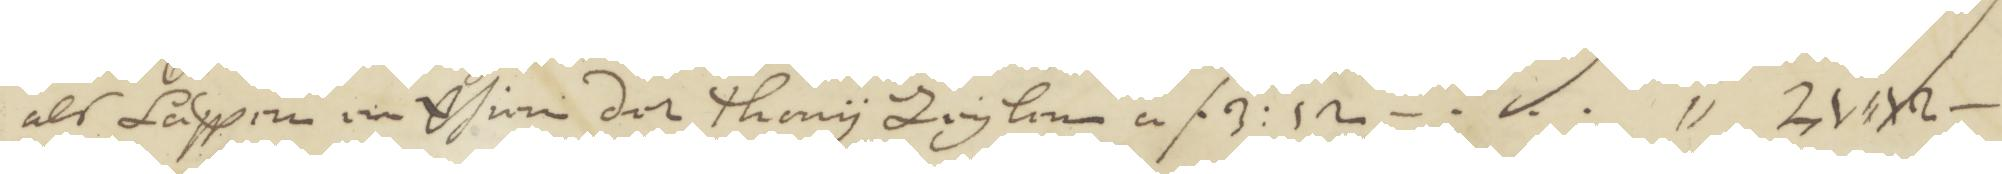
als Lappen en versien der thonij zeijlen a ƒ3:12 — . . . „ 21„12 —
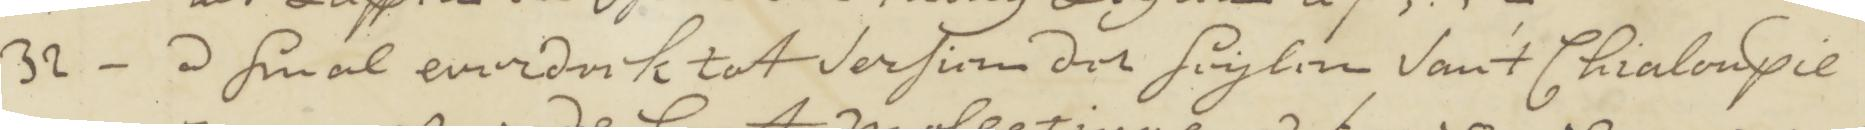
32 — a smal everdoek tot versien der seijlen van’t Chialoupie
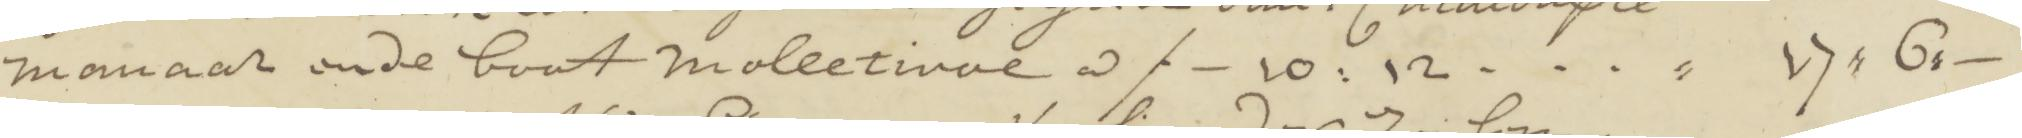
manaar en de boot moleetival a ƒ – 10: 12 - . . „ 17„ 6„ —
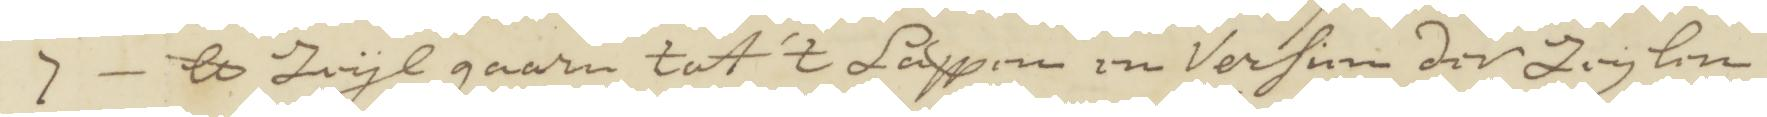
7 — lb zeijl gaarn tot ’t Lappen en versien der zeijlen
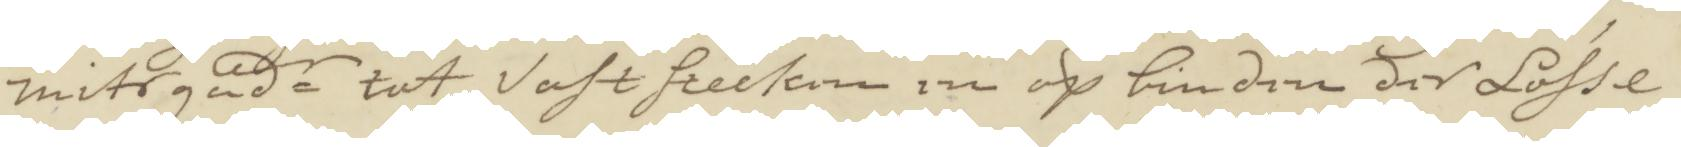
mitsgad=s tot vast steecken en op binden der Losse
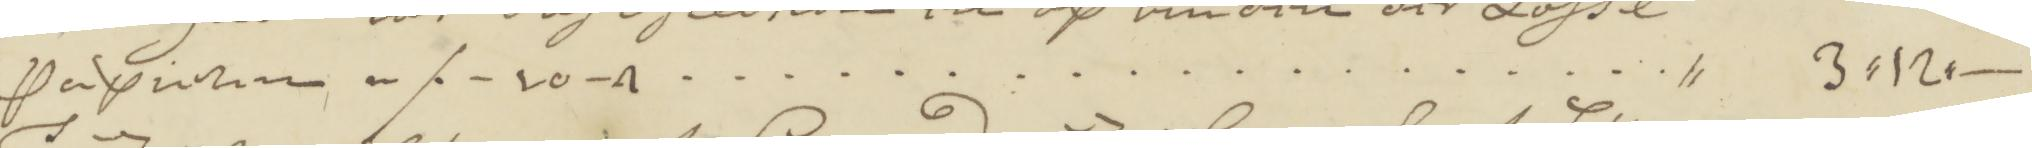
Papieren a ƒ - 10 -4 . . . . . . . . . . . . . . . . . . . „ 3„12„—
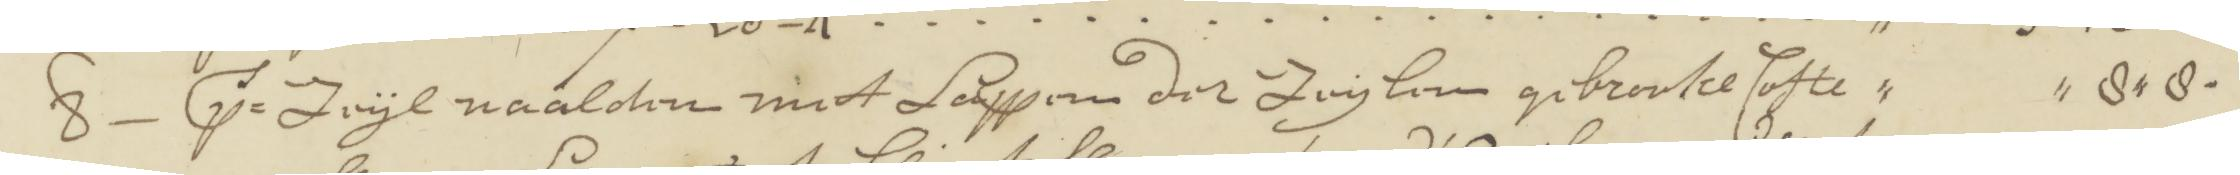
8 — p=s zeijl naalden met Lappen der zeijlen gebrooke Coste „ „ 8„ 8-
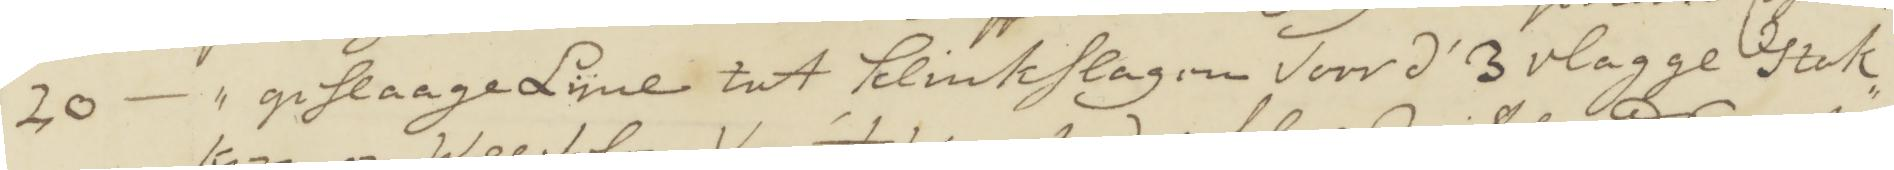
20 —„ geslaage Lijne tot klinkslagen voor d’ 3 vlagge stok„
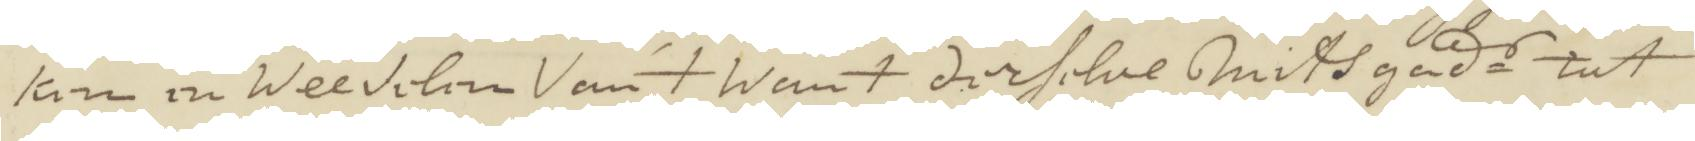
ken en weevelen van ’t want derselve mitsgad=s tot
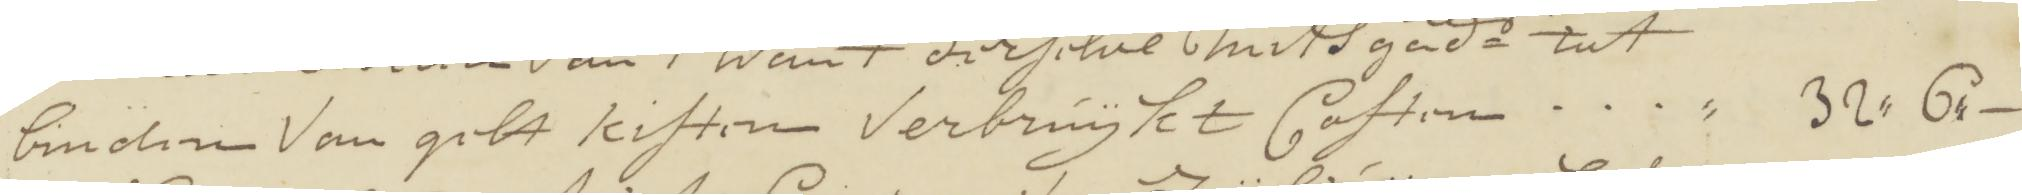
binden van gelt kisten verbruijkt Costen . . . „ 32„6„ —
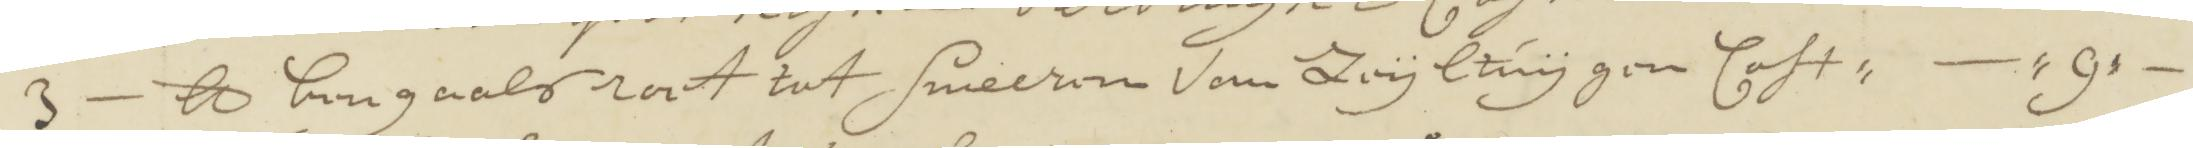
3 — lb bengaals roet tot smeeren van zeijltuijgen Cost„ — „9„—
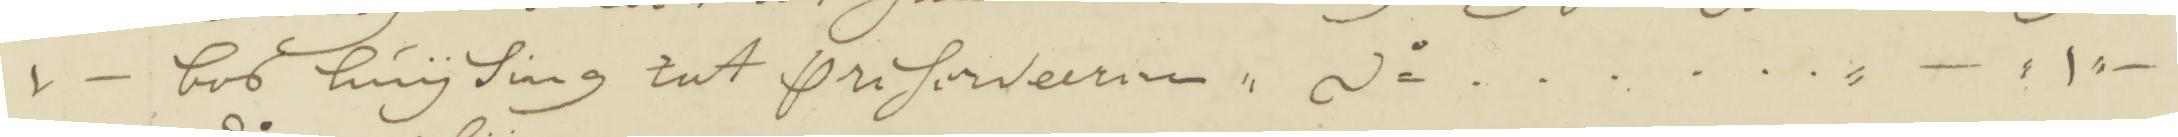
1 — bos huijsing tot preserveeren „ d=o . . . . . . „ — „ 1 „ —
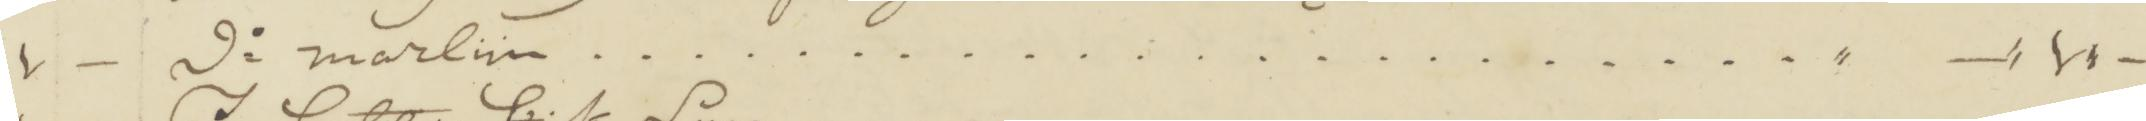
1 — d=o marlijn . . . . . . . . . . . . . . . . . . . . . . . „ —„1„—
